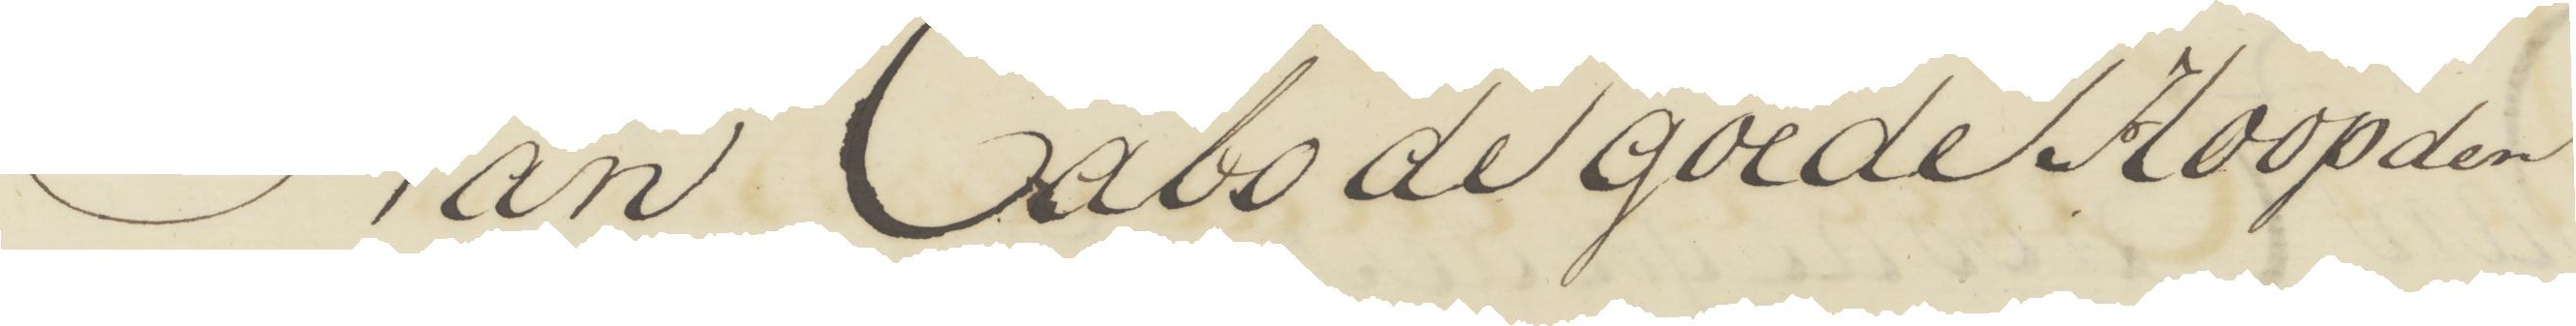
Van Cabo de goede Hoop den
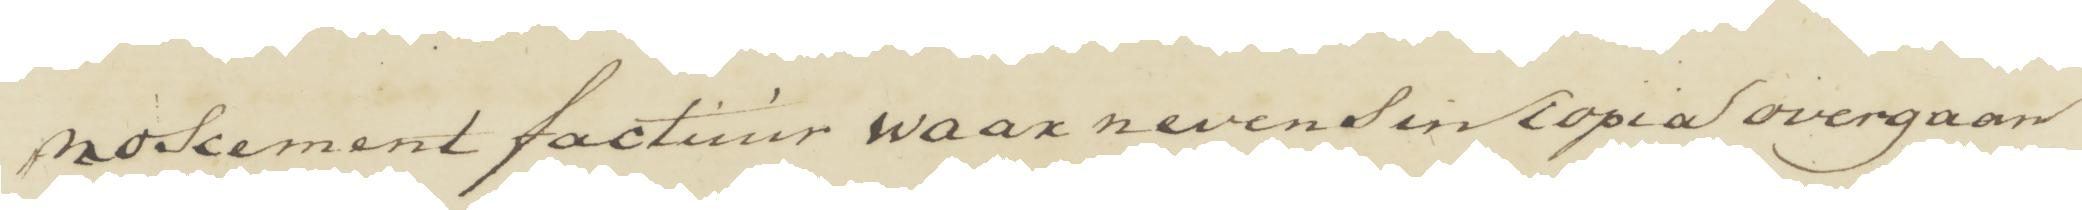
„noscement factuur waar nevens in copia overgaan
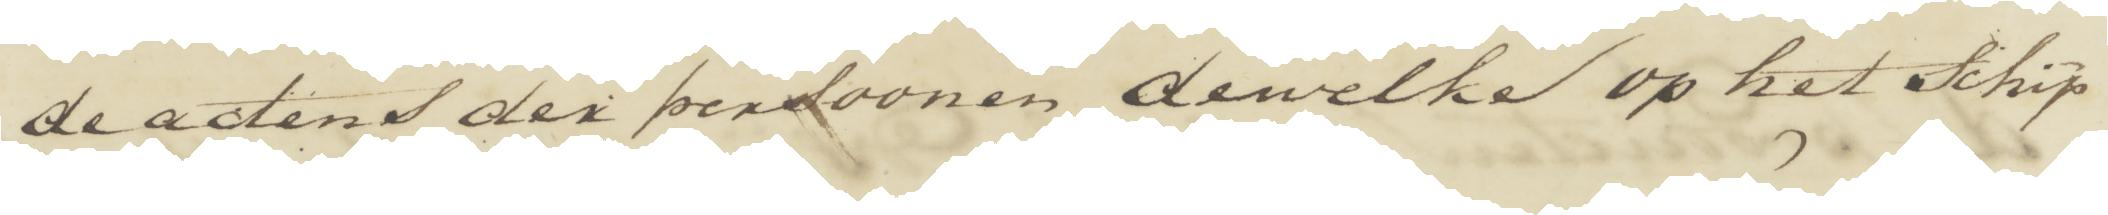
de actens der persoonen dewelke op het schip
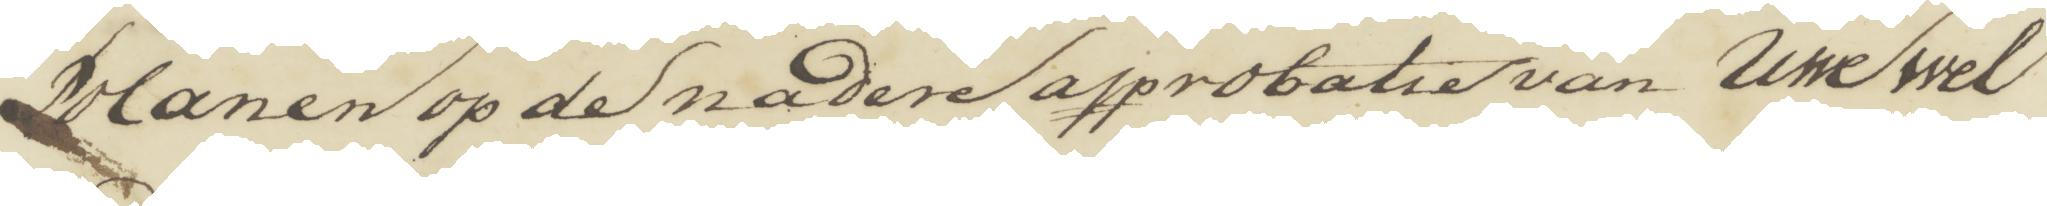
Polanen op de nadere approbatie van uwe wel
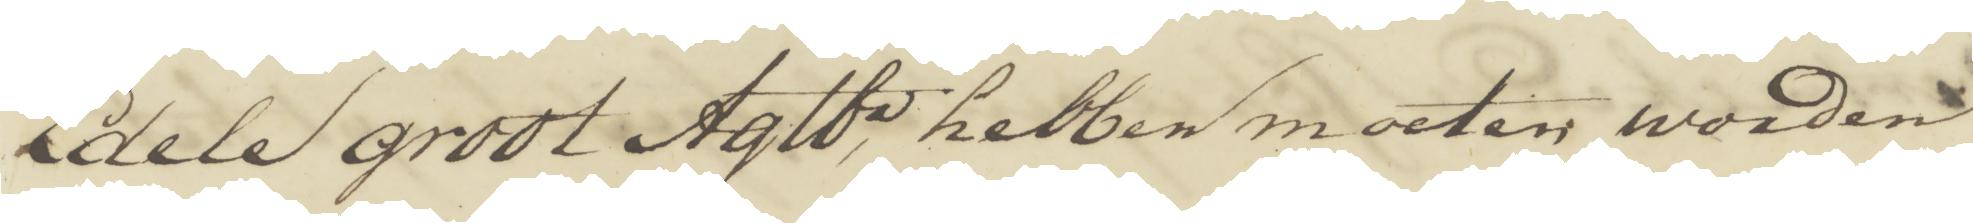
Edele groot Agtb,r hebben moeten worden
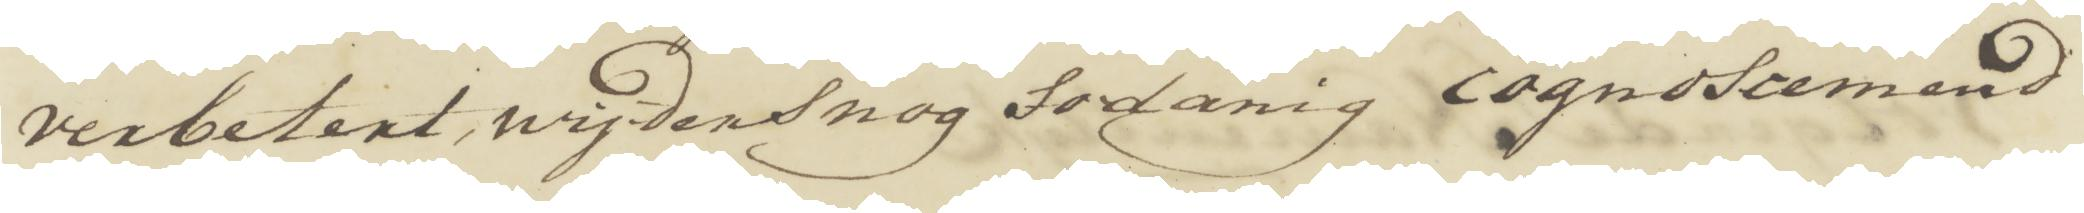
verbetert, wijders nog sodanig cognoscemend
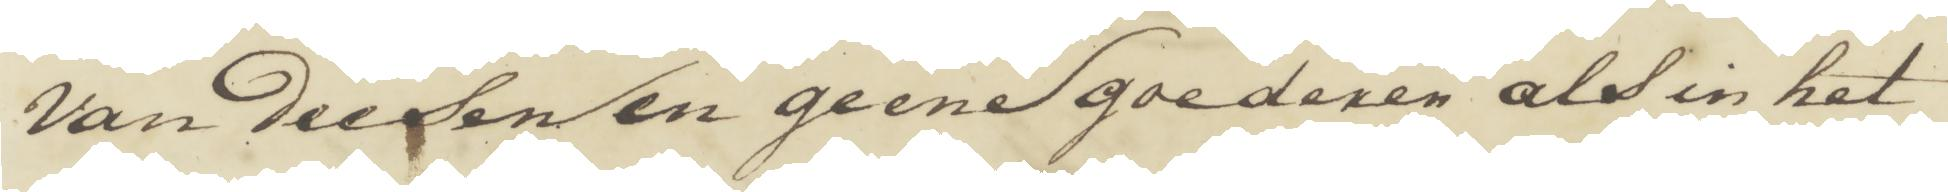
van deesen en geene goederen als in het
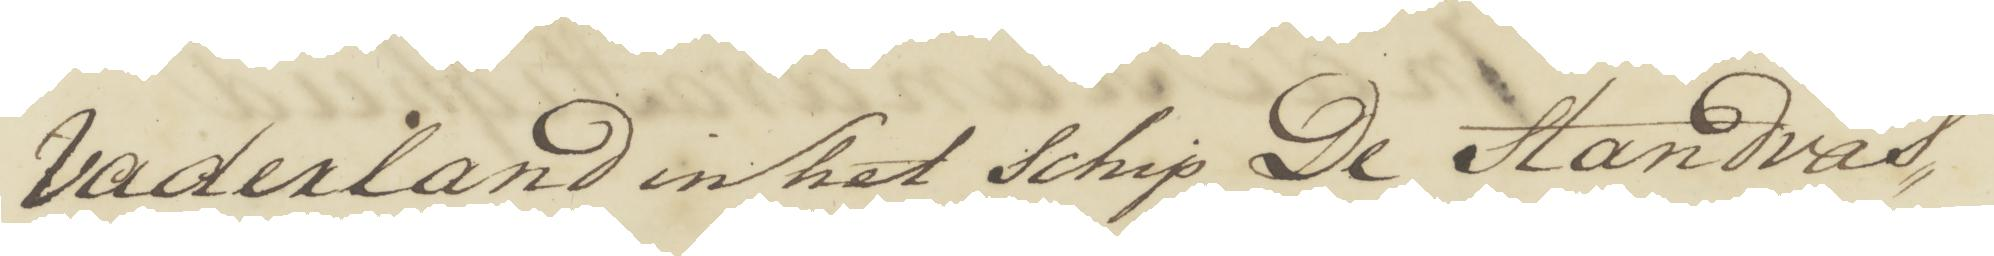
vaderland in het schip De standvas„
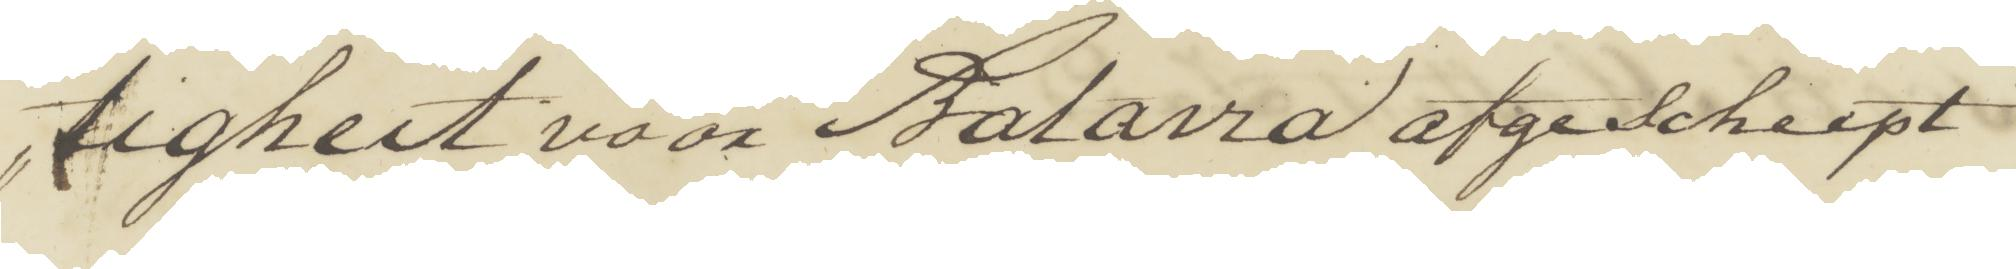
„tigheit voor Batavia afgescheept
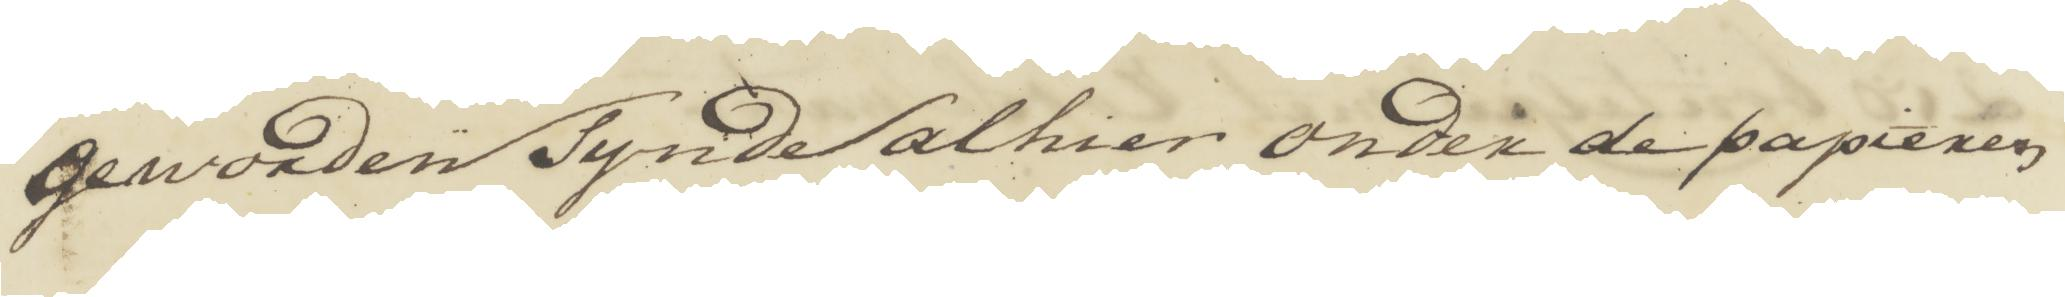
geworden synde alhier onder de papieren
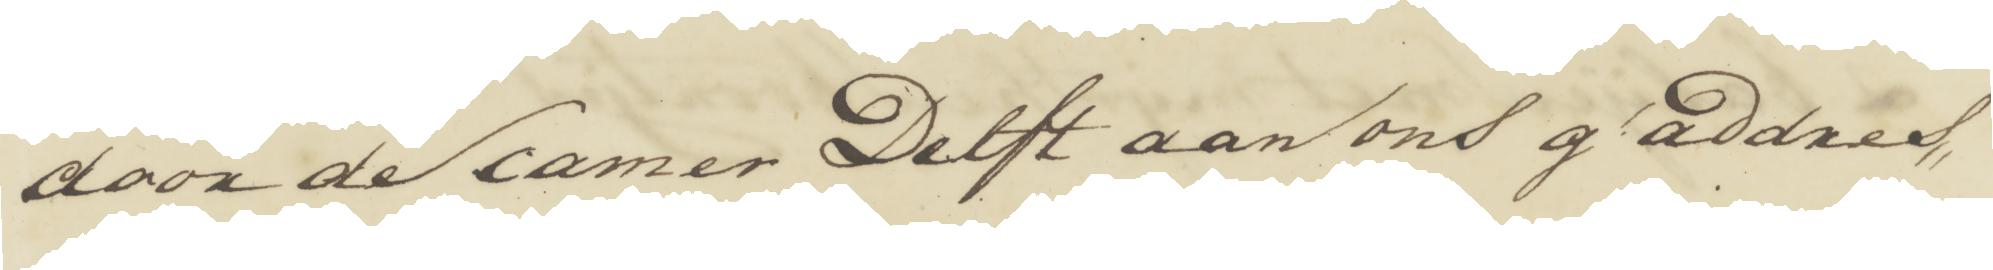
door de camer Delft aan ons g’addres„
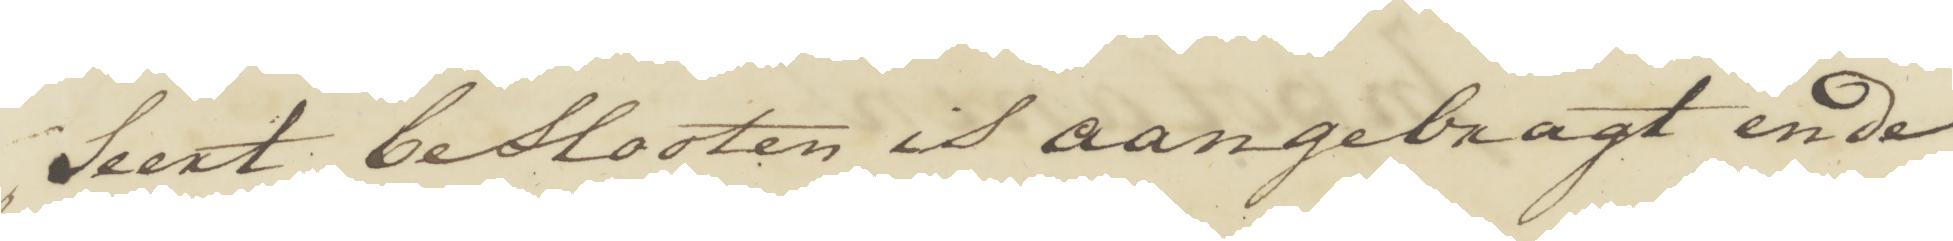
seert beslooten is aangebragt en de
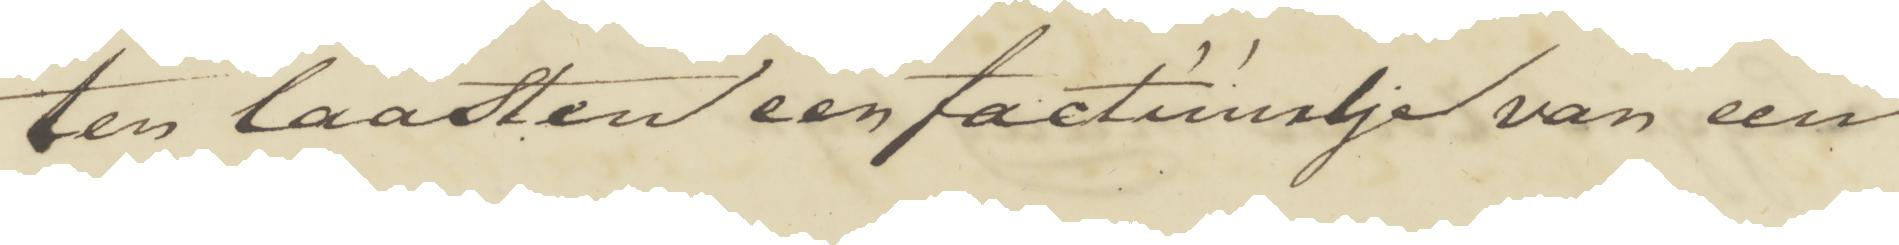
ten laasten een factuurtje van een
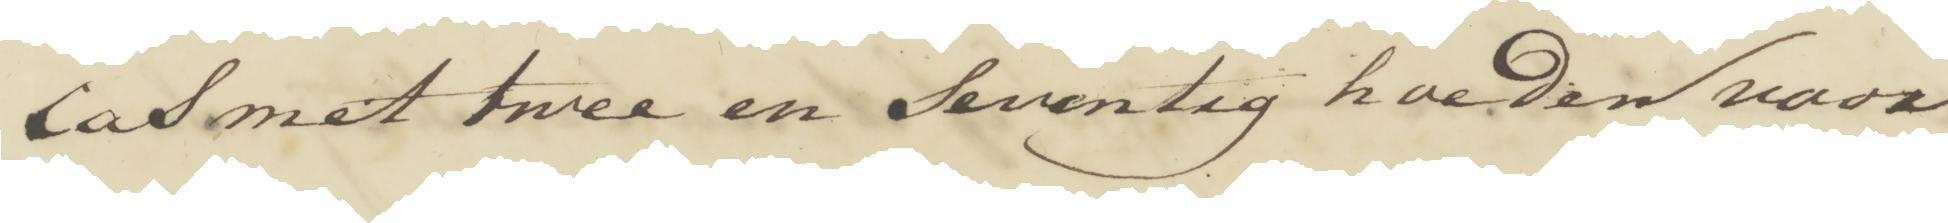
cas met twee en seventig hoeden voor
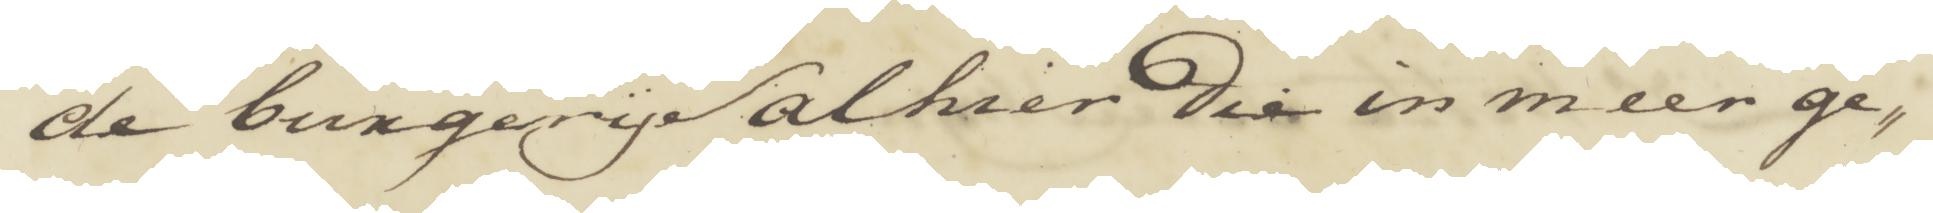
de burgerije alhier die in meer ge„
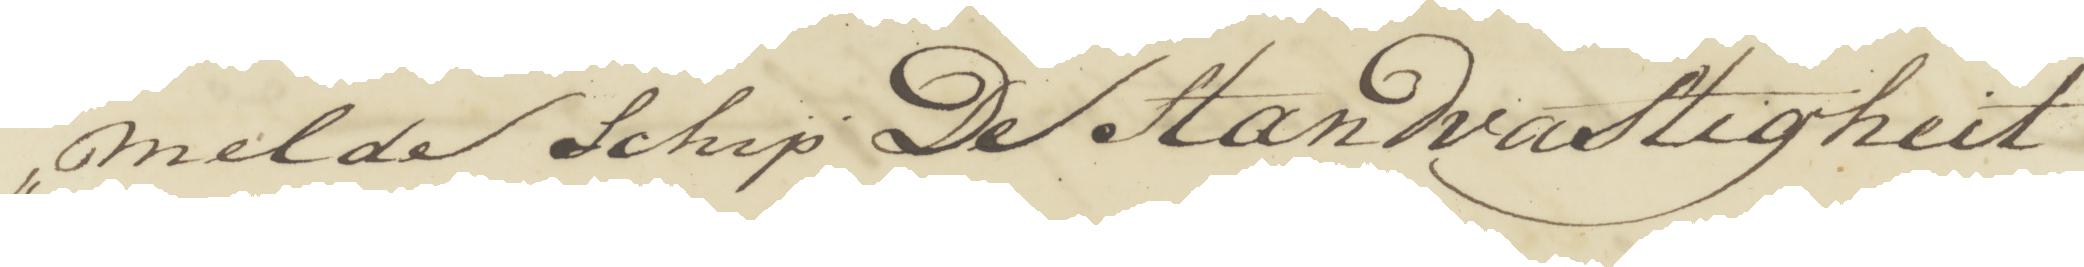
„melde schip De standvastigheit
